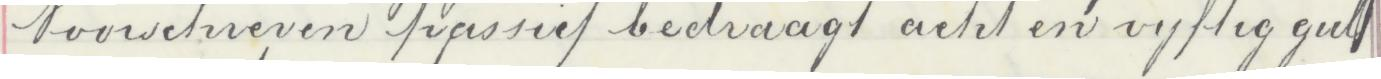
Voorschreven passies bedraagt acht en vyftig gul
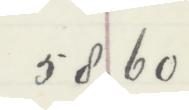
58 60
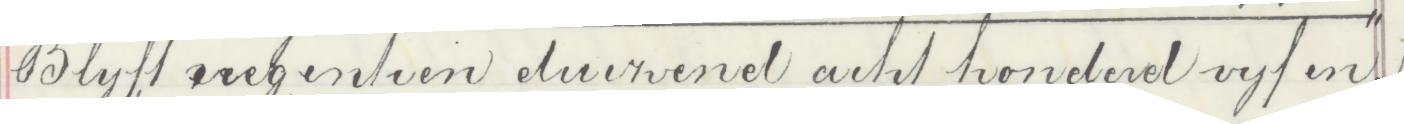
Blyft negentien duizend acht honderd vyf en
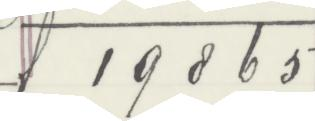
ƒ 19065
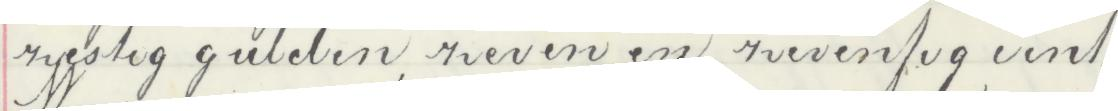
zestig gulden zeven en zeventig cent
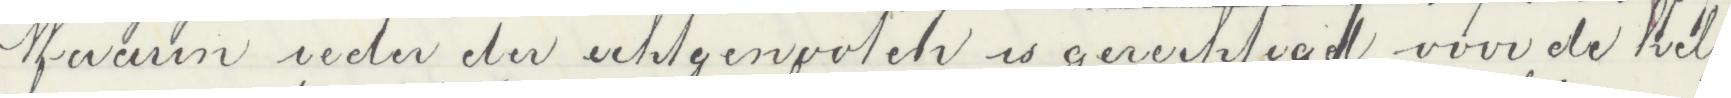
Waarin ieder der echtgenooten is gerechtigd voor de helft
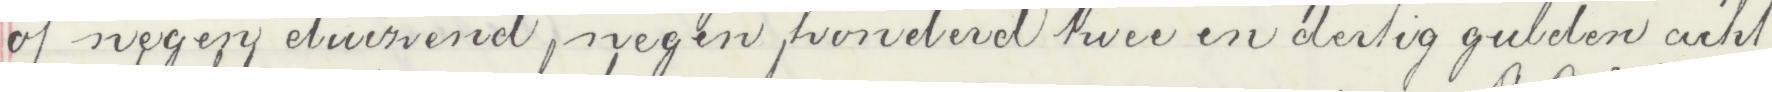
of negen duizend negen honderd twee en dertig gulden acht
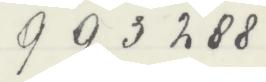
993288
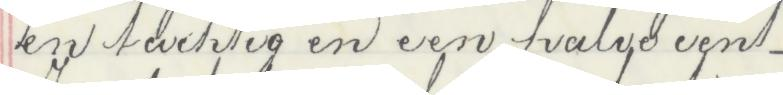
en tachtig en een halve cent
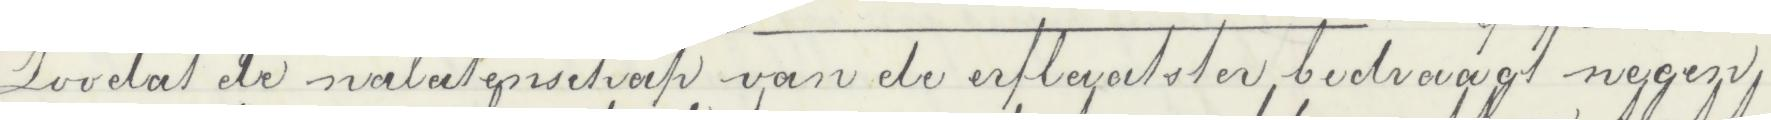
Zoodat de nalatenschap van de erflaatster bedraagt negen
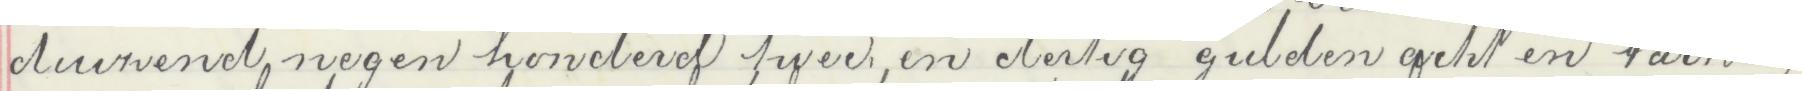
duizend negen honderd twee, en dertig gulden acht en tachtig
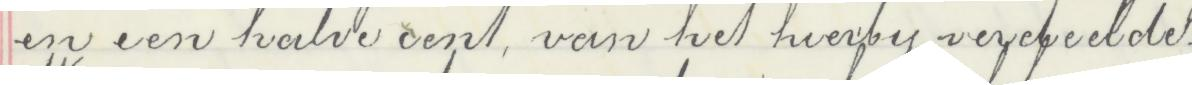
en een halve cent, van het hierby verepeelde
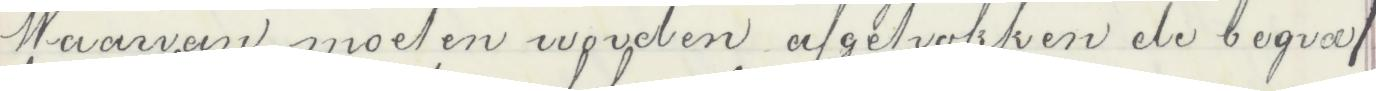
Waarvan moeten worden afgetokken de begra
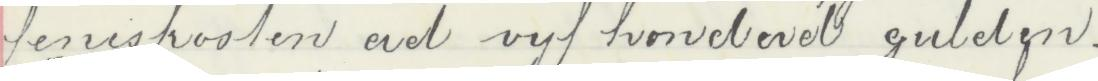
feniskosten ad vyf honderd gulden
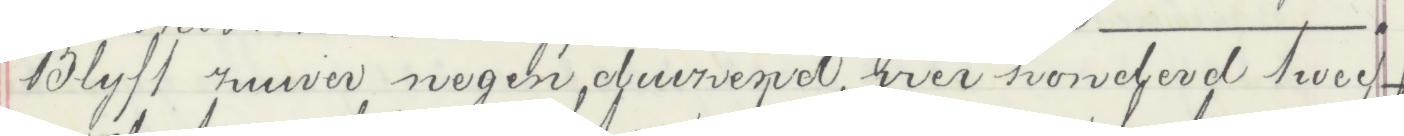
Blyft zuiver negen duizend vier honderd twee
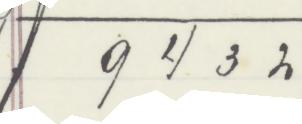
ƒ 9432
